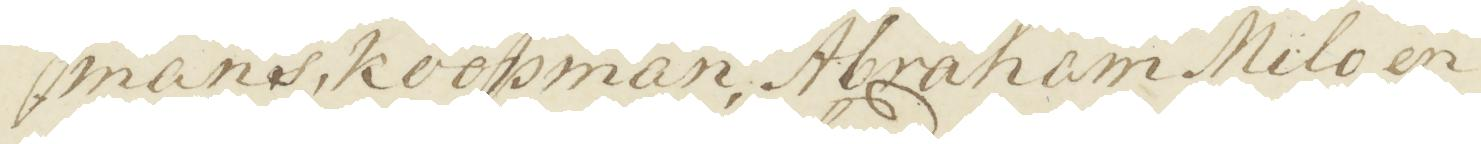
mans, Koopman, Abraham Milo en
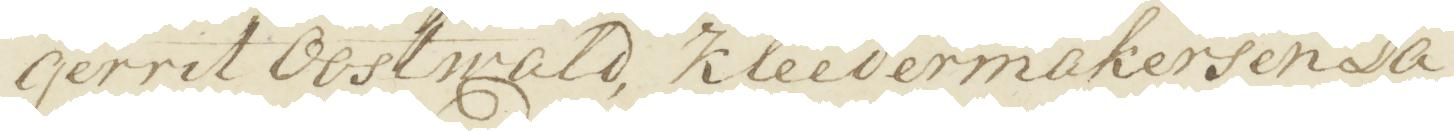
Gerrit Oostwald, Kleedermakers en Da
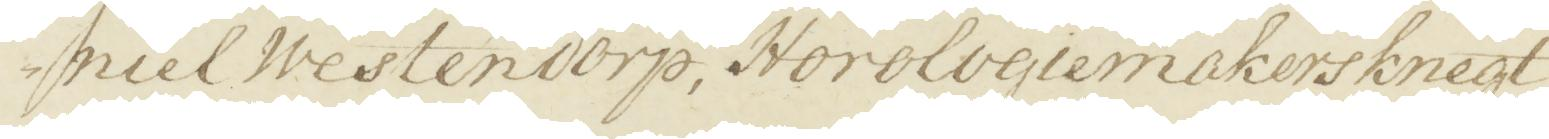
„niel Westendorp, Horologiemakersknegt,
